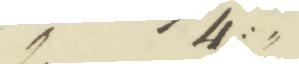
„ 4:„
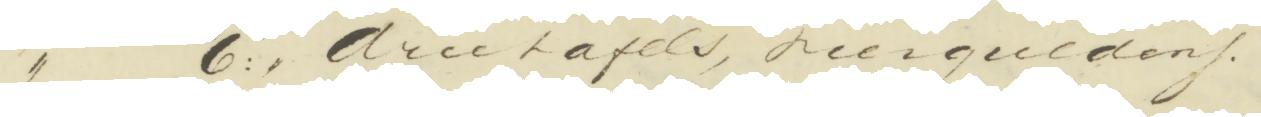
„ 6:„ drie tafels, vier guldens.
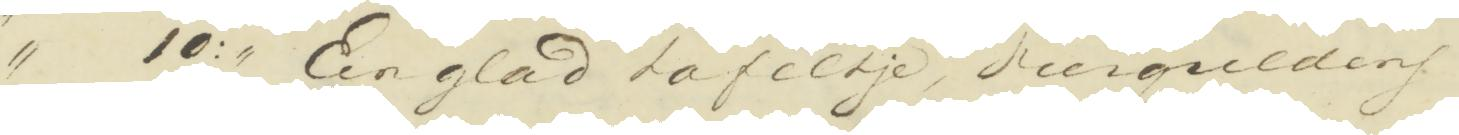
„ 10: „ Een glad tafeltje, vierguldens
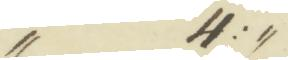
„ 4. „
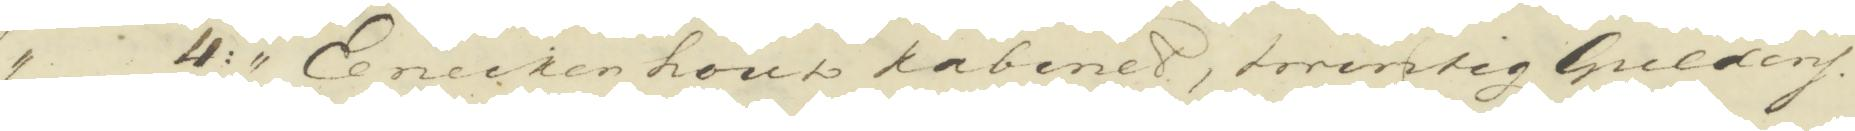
„ 4: „ Eeneiken hout kabinet, twintig Guldens.
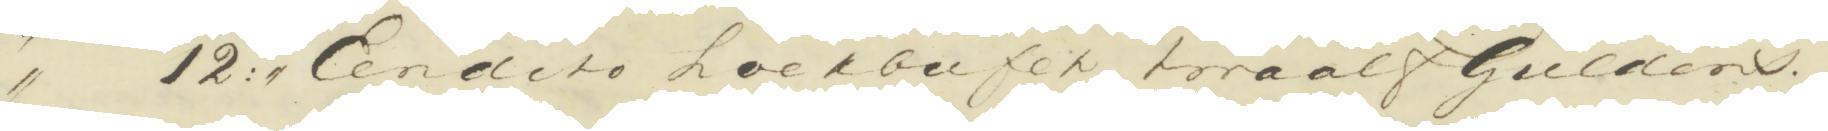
„ 12:„ Een dito hoekbufet, twaalf Guldens.
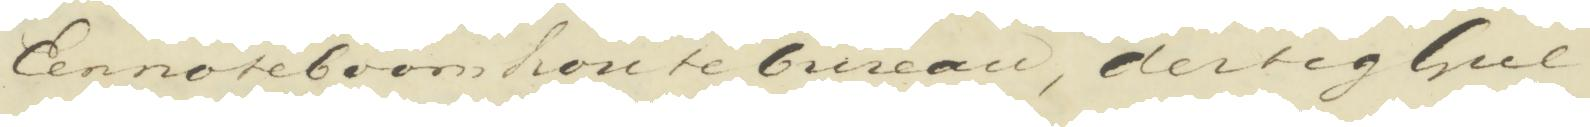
Een noteboom houte bureau, dertig Gul
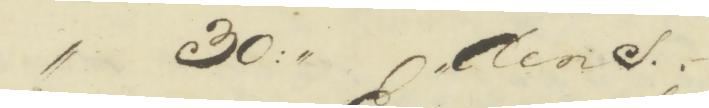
„ 30.„ „dens.
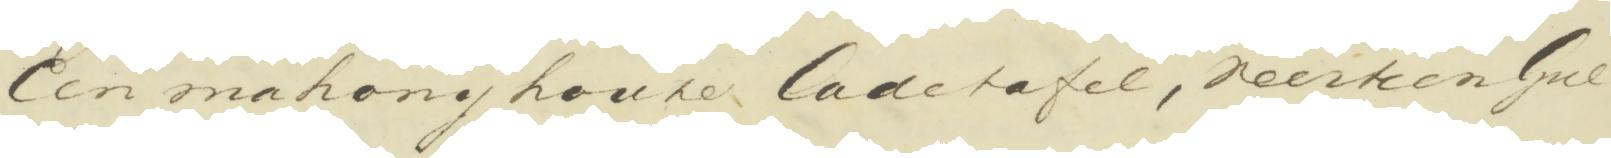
Een mahony houte ladetafel, veertien Gul
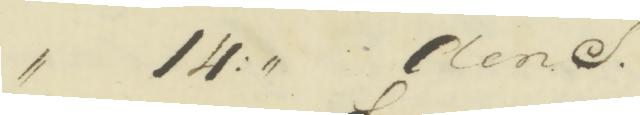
„ 14:„ dens.
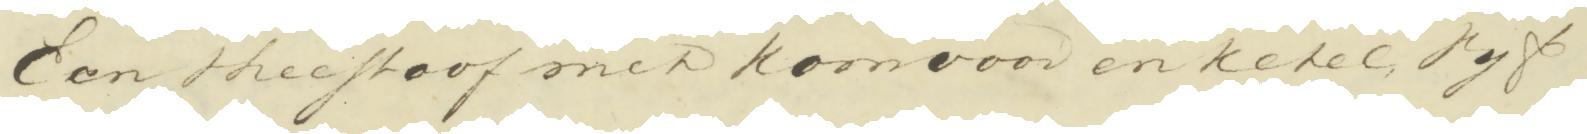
Een theestoof met komvoor en ketel, Vyf
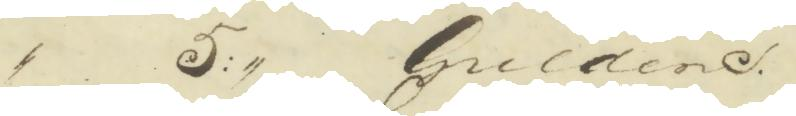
„ 5:„ Guldens.
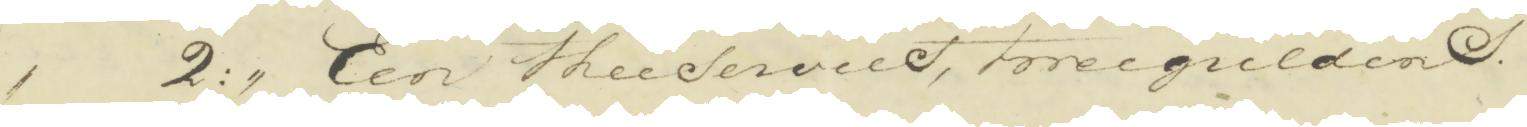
„ 2: „ Een theeservies, twee guldens.
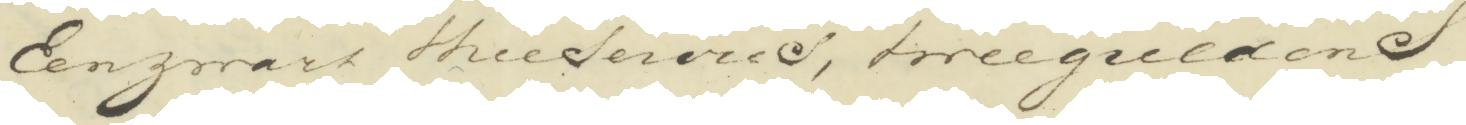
Een zwart theeservies, twee guldens
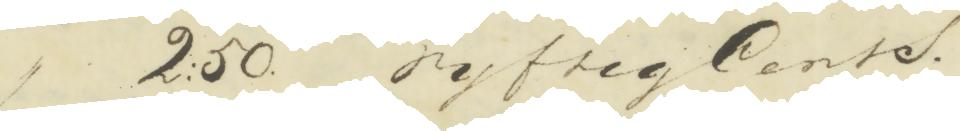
„ 2:50. vyftig Cents.
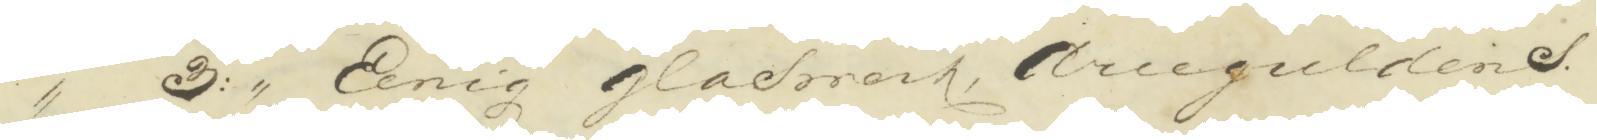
„ 3: „ Eenig glaswerk, drie guldens.
